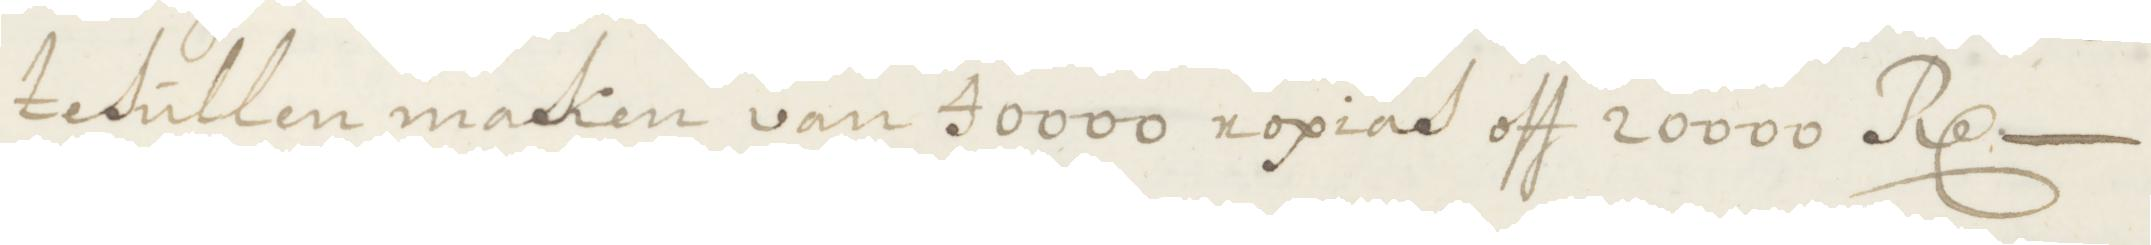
te sullen maken van 10000 ropias off 20000 Rx —
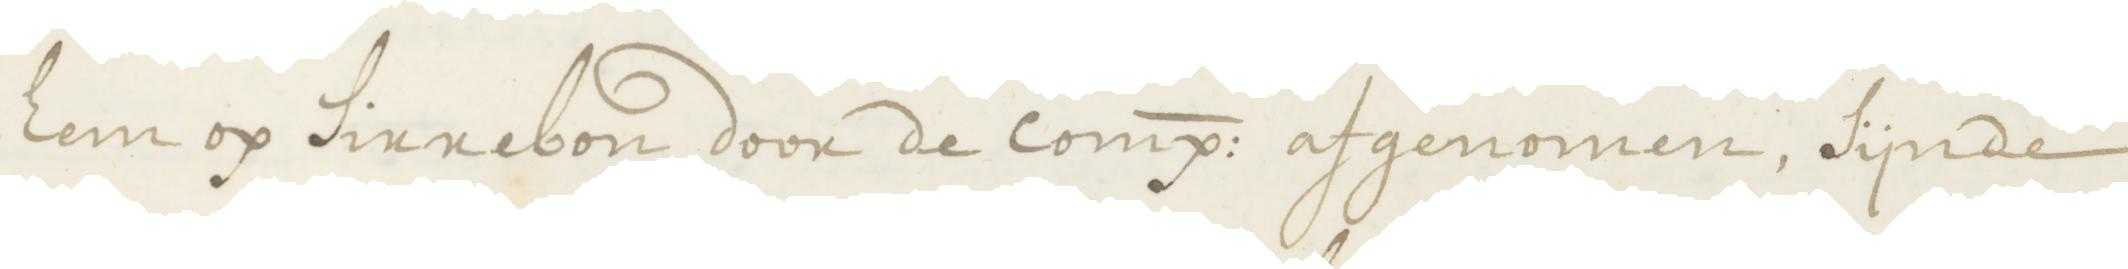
hem op sirrebon door de Comp: afgenomen, sijnde
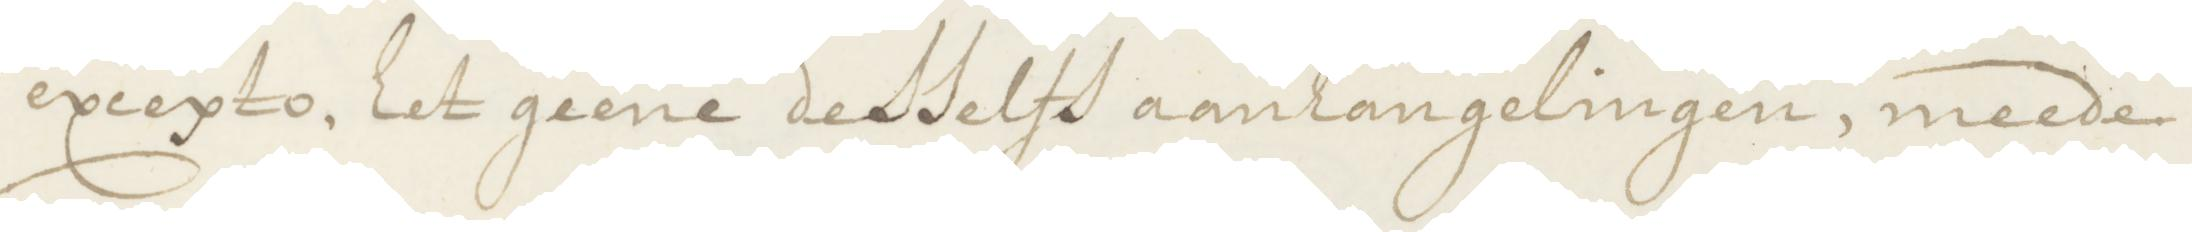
excepto, het geene desselfs aanhangelingen, meede
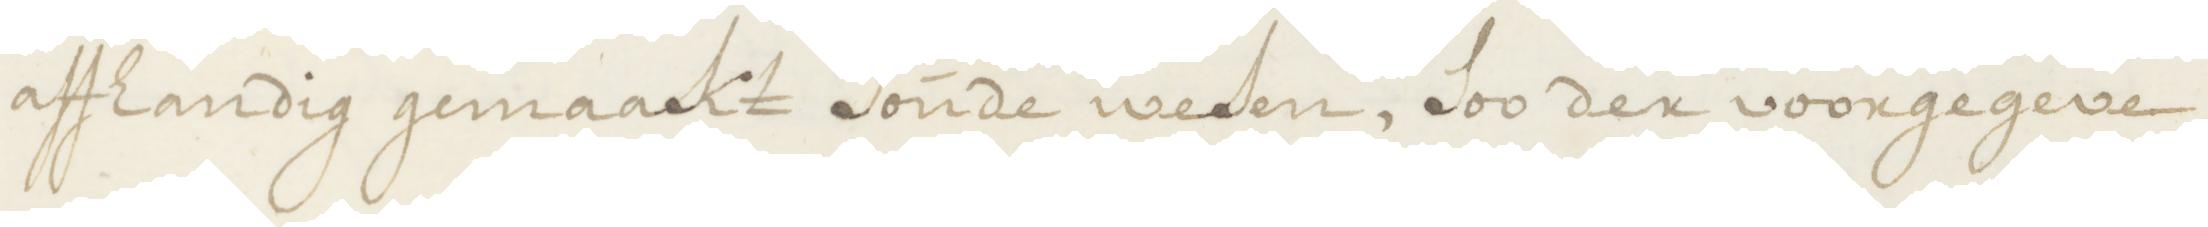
affhandig gemaakt soude wesen, soo der voorgegeve
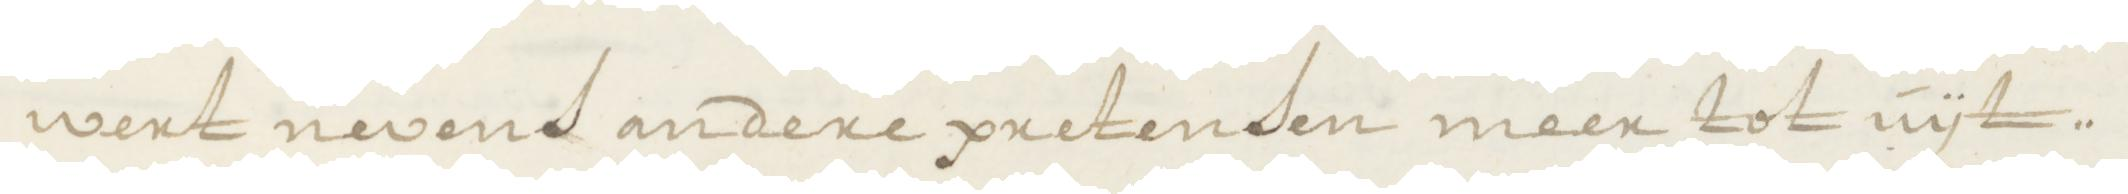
wert nevens andere pretensen meer tot uijt„
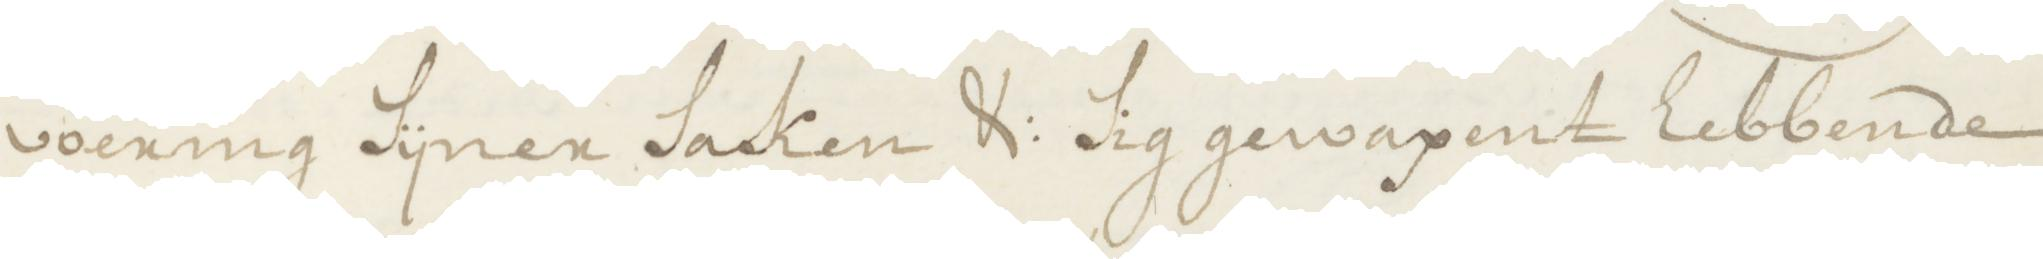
voering sijner saken &: sig gewapent hebbende
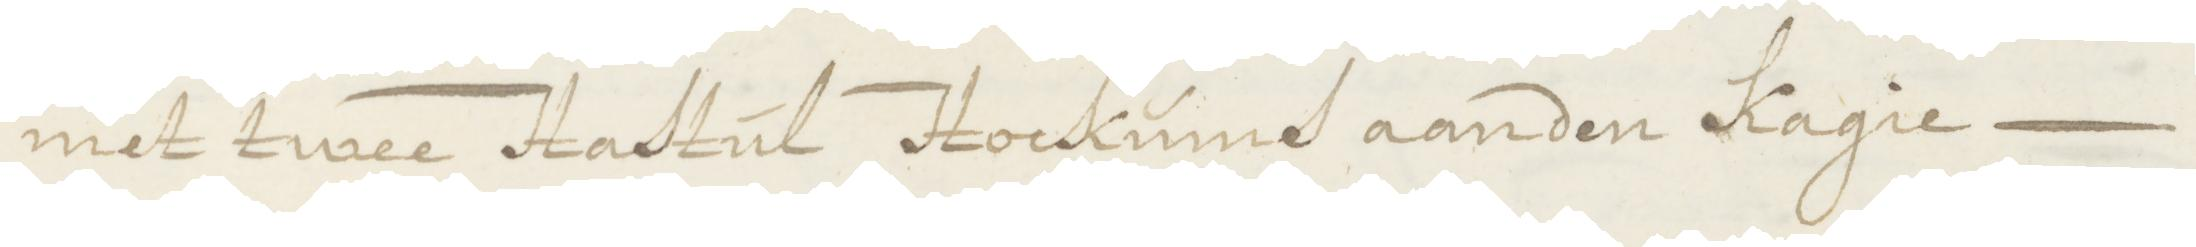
met twee Hastul Hockums aan den kagie —
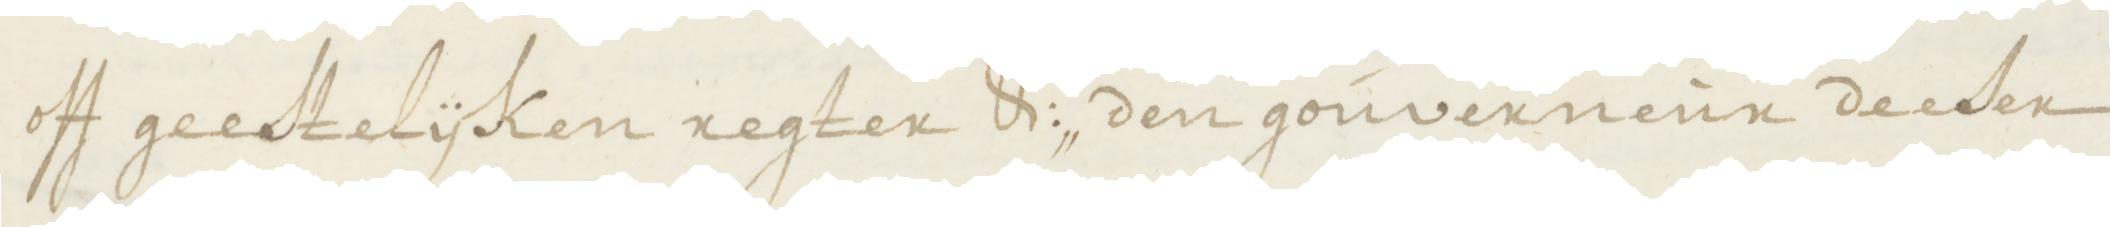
off geestelijken regter &:„ „op den gouverneur deeser
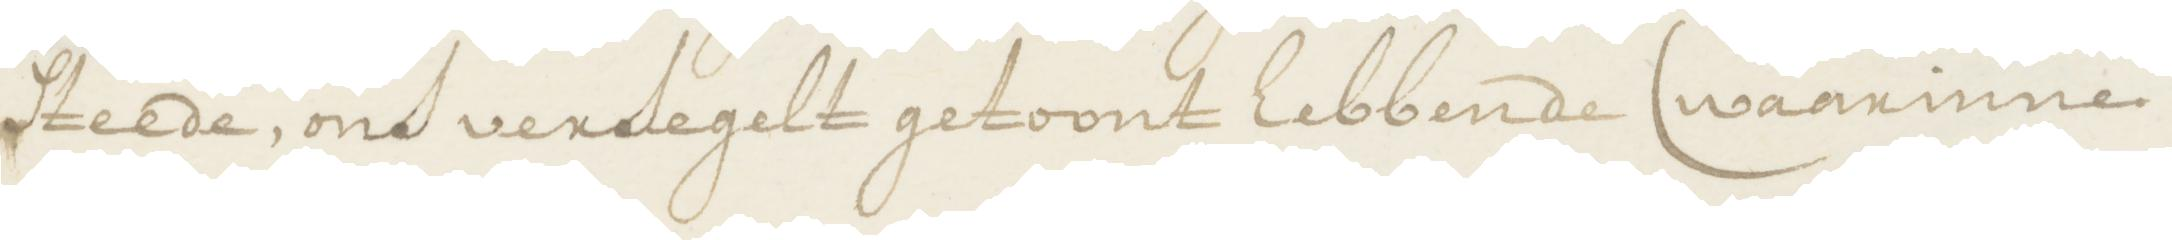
steede, ons versegelt getoont hebbende (waarinne
